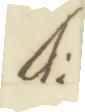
5: 4:
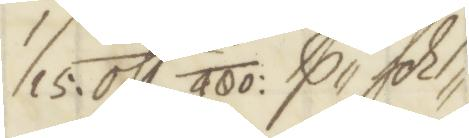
1/15 off 17/480: p„s sch„s
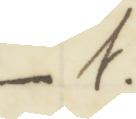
— 1
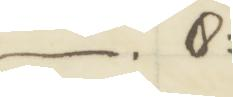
— . 8
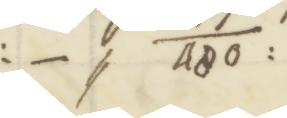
— „ 117/480:
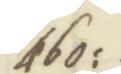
6 29/460:
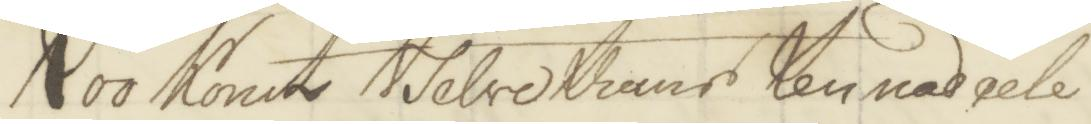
Zoo komt 'tselve thans ten nadeele
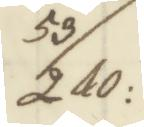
53/240:
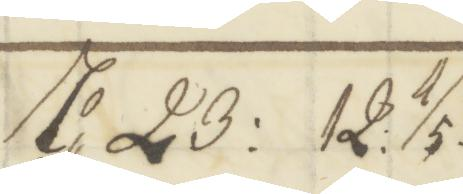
r„o 23: 12: 4/5
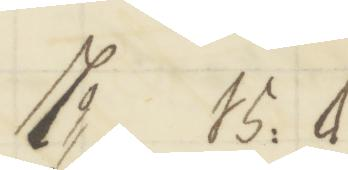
r„o 15: 4
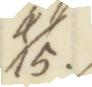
4/15.
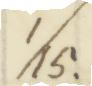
1/15.
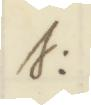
1: 1/15„
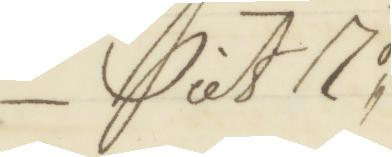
Piet r„o
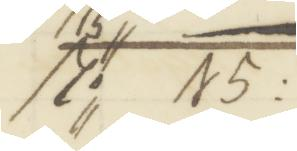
r„o 15:
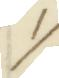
7 1/5.
